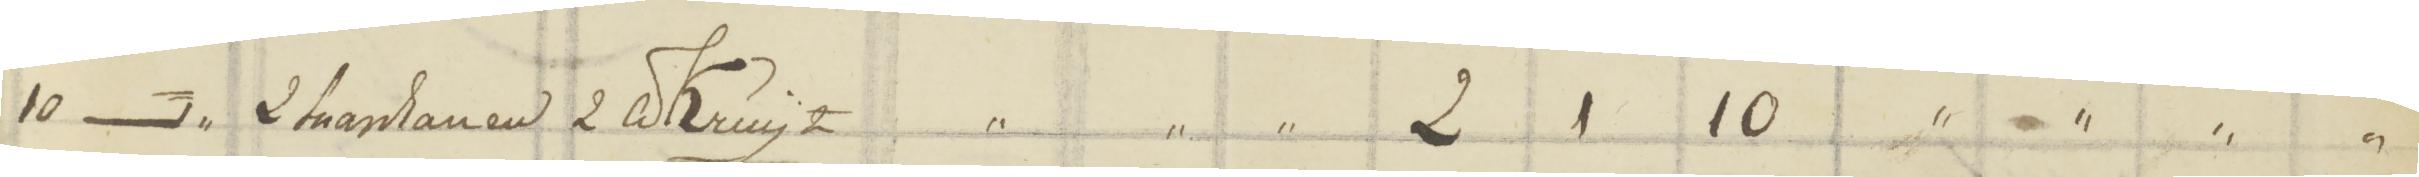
10 _„' 2 snaphanen 2 ld Kruijt „ „ „ 2 1 10 „ „ „
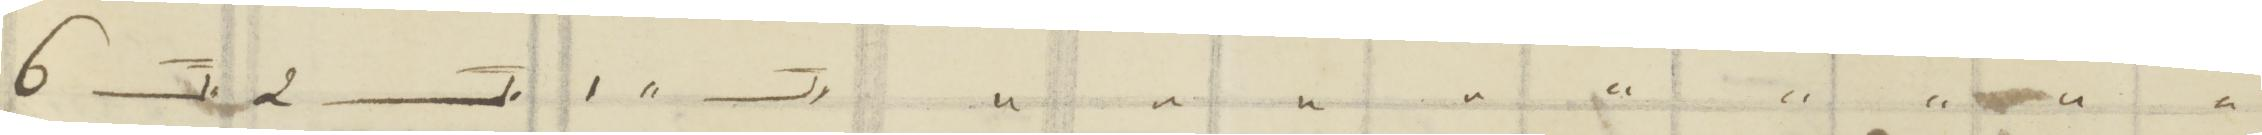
6 _„' 2 _„' 1 „ _„o „ „ „ „ „ „ „ „ „ „
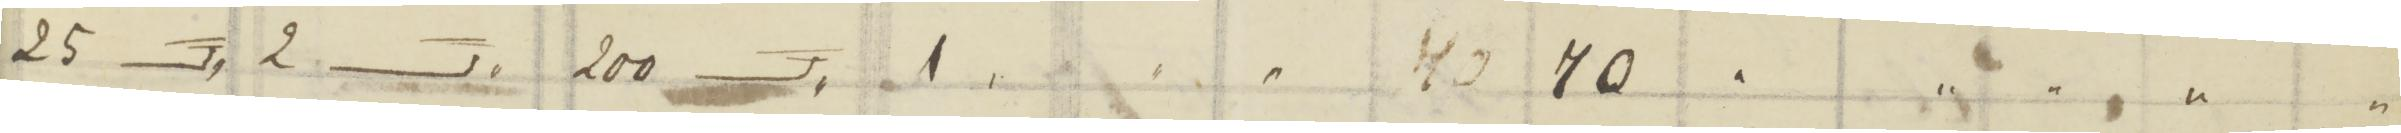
25 _„' 2 _„' 200 _„' 1 „ „ „ 70 „ „ „ „ „ „
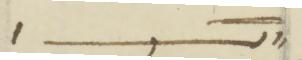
1 _„
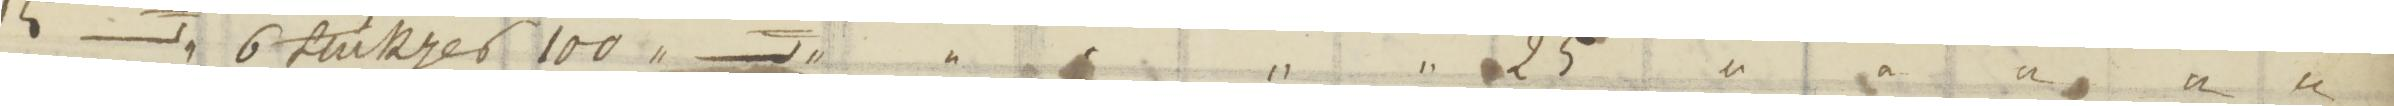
15 _„' 6 stukjes 100 „ _ „ „ „ „ „ 25 „ „ „ „ „
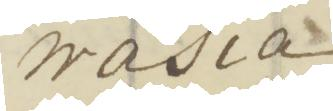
wasia
